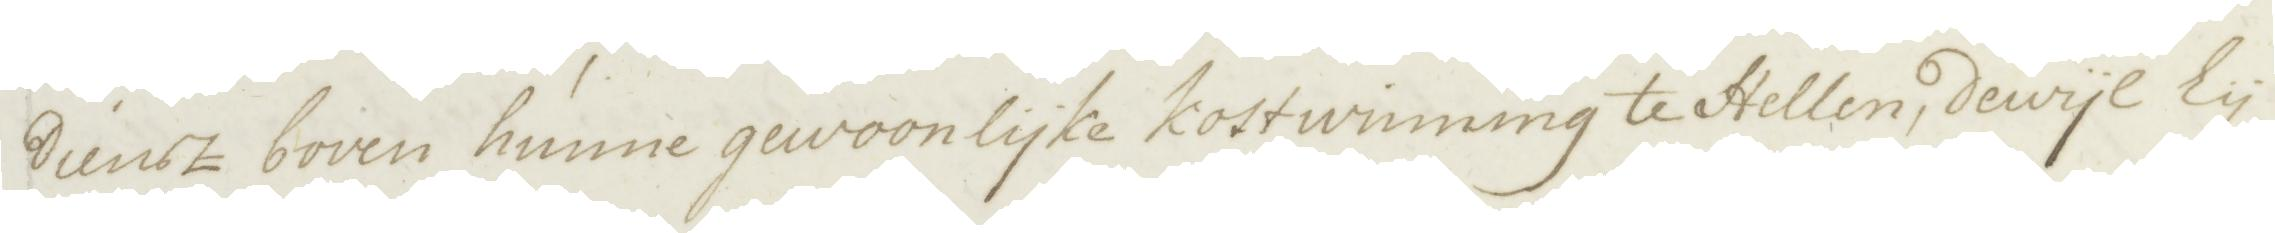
Dienst boven hunne gewoonlijke kostwinning te stellen, dewijl hij
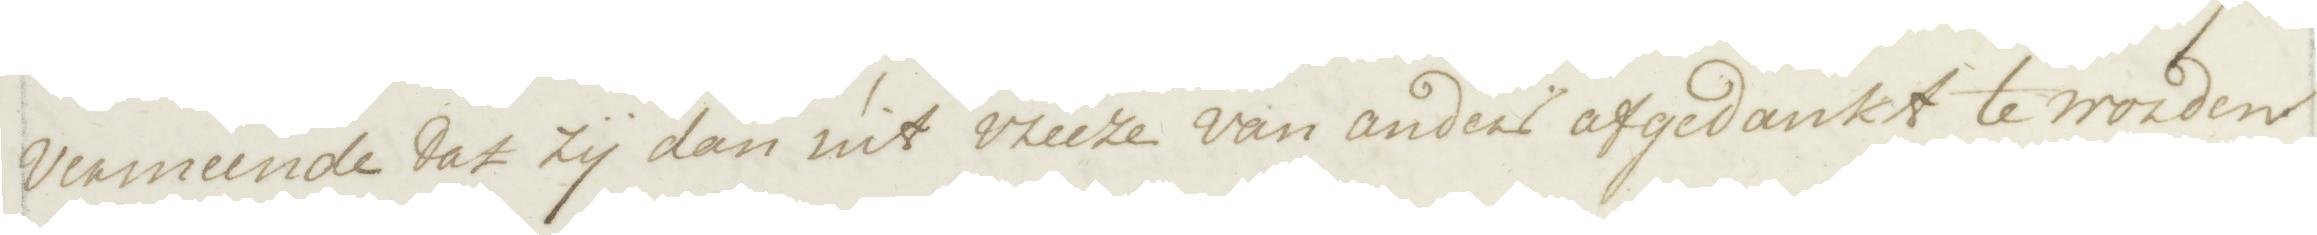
vermeende dat zij dan uit vreeze van anders afgedankt te worden
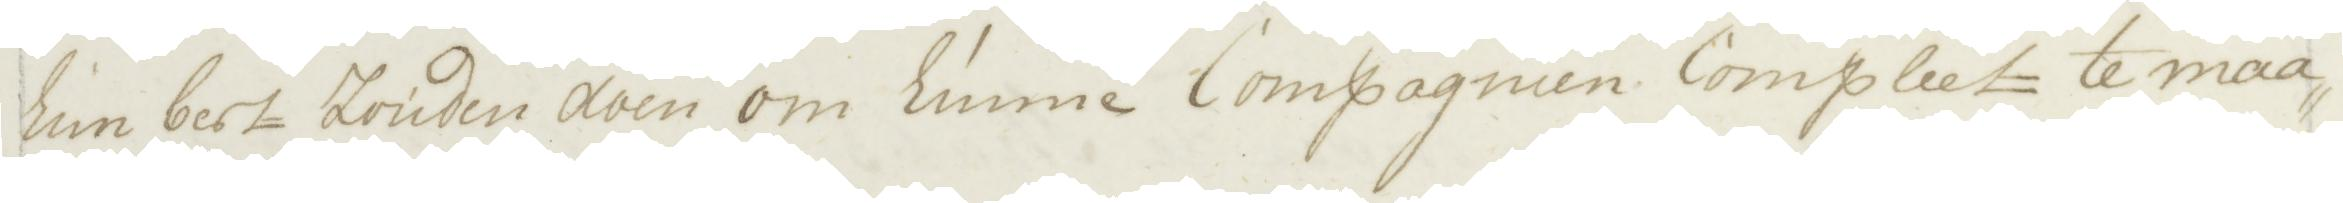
hun best Zouden doen om hunne Compagnien Compleet te maa„
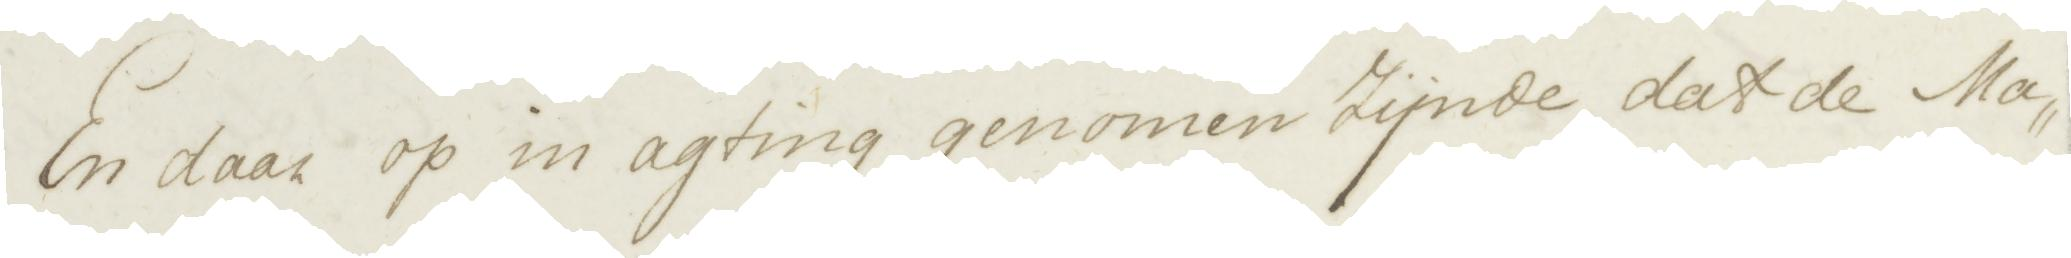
En daar op in agting genomen Zijnde dat de Ma„
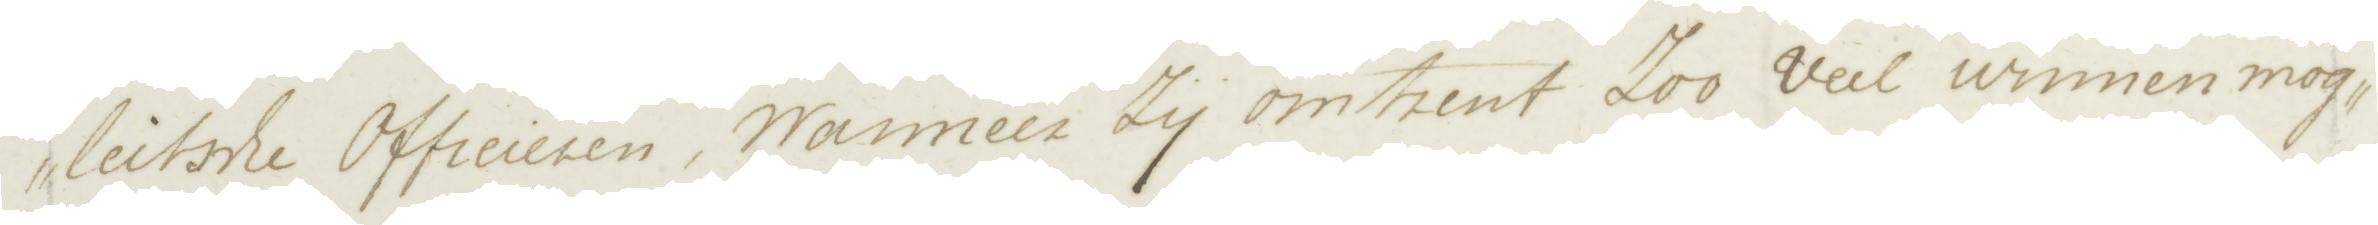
„leitsche Officieren, wanneer Zij omtrent Zoo veel winnen mog„
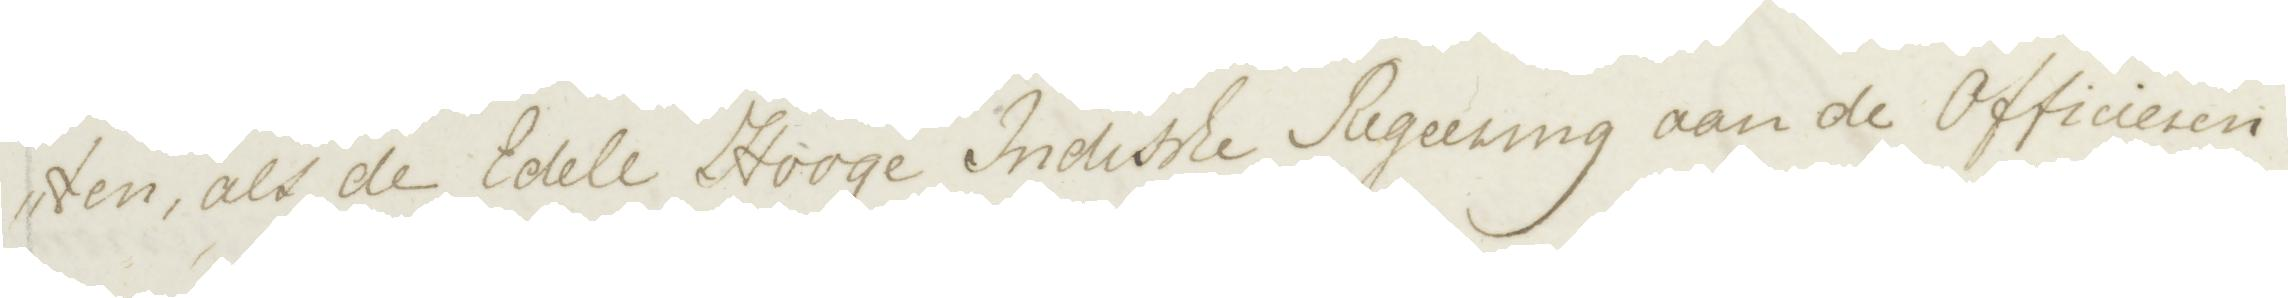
„ten, als de Edele Hooge Indische Regeering aan de Officieren
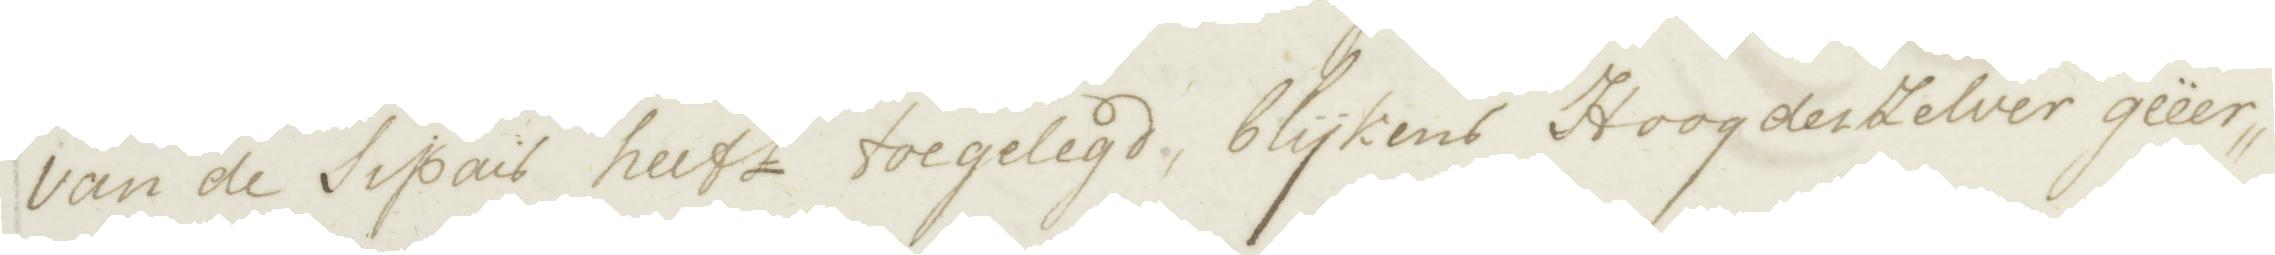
van de Sipais heeft toegelegd, blijkens Hoog derzelver geëer„
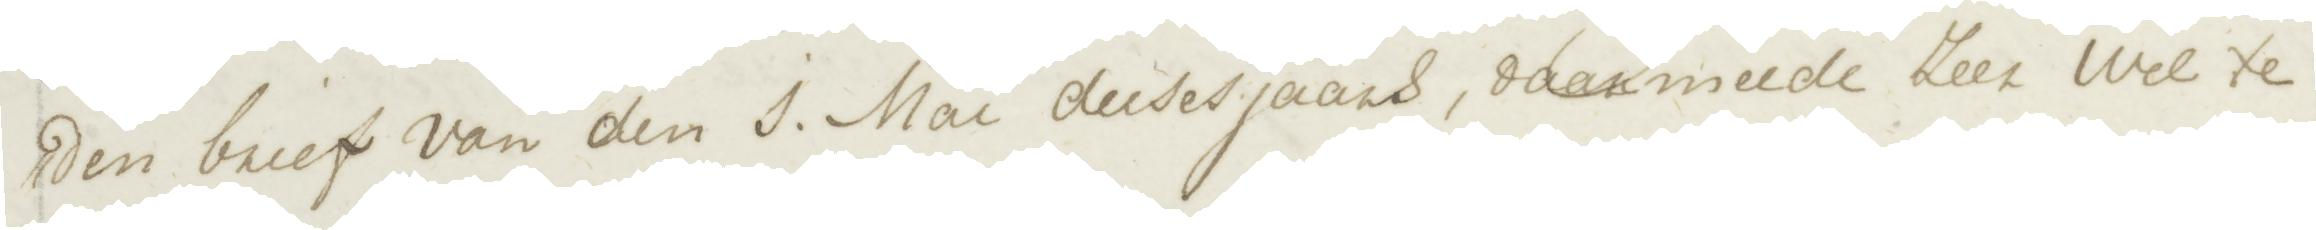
„den brief van den 1. Mai deeses jaars, daarmeede Zeer wel te
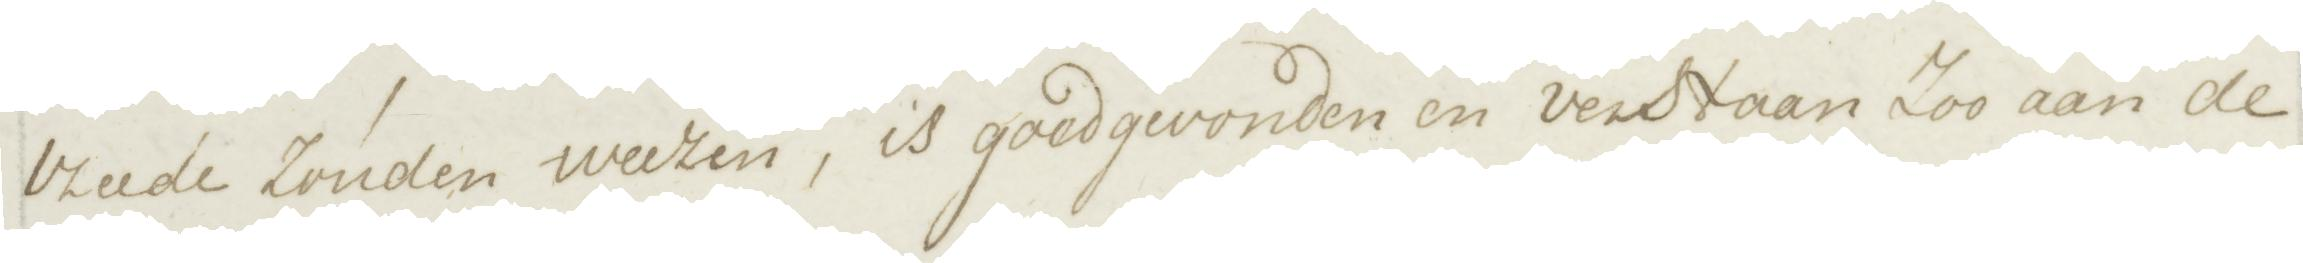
vreede Zouden weezen, is goedgevonden en verstaan Zoo aan de
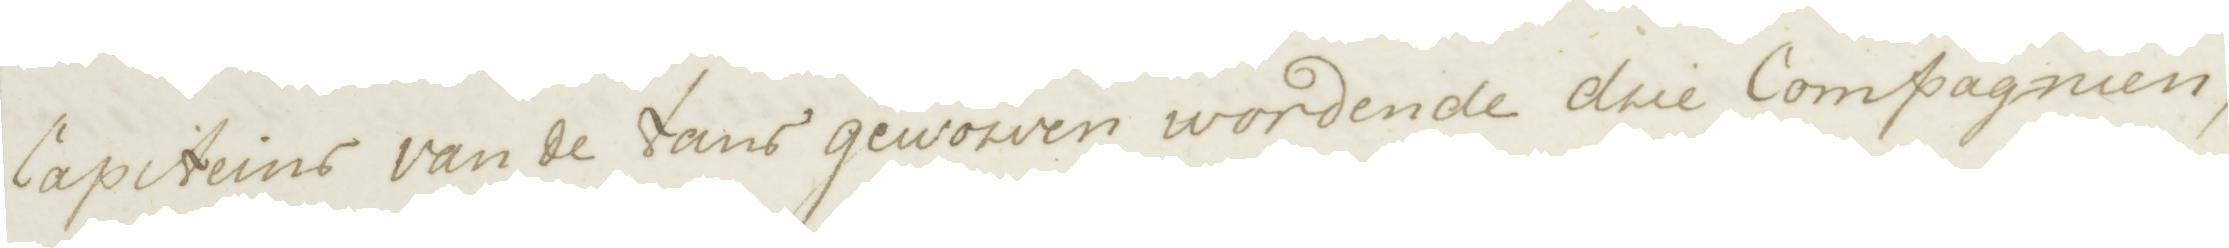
Capiteins van de tans geworven wordende drie Compagnien,
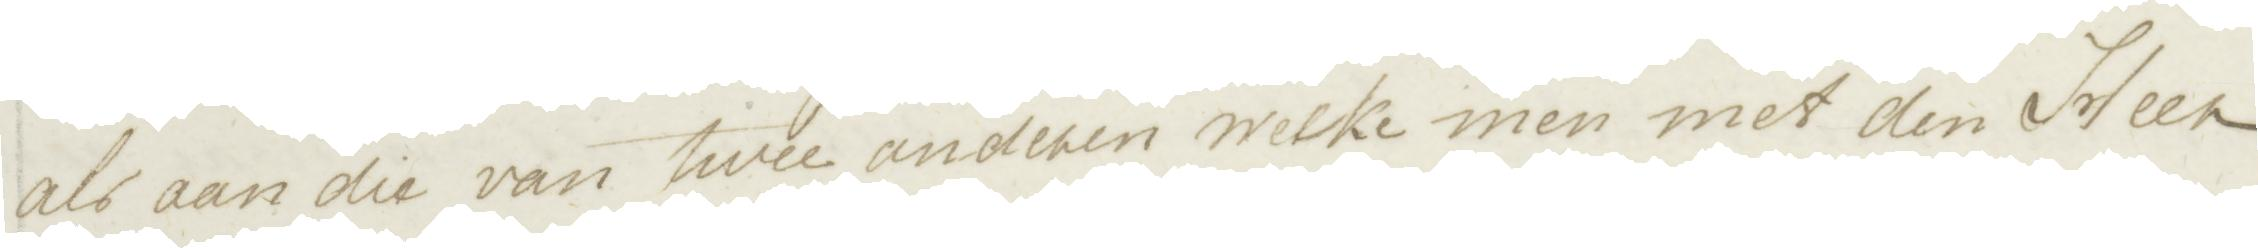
als aan die van twee anderen welke men met den Heer
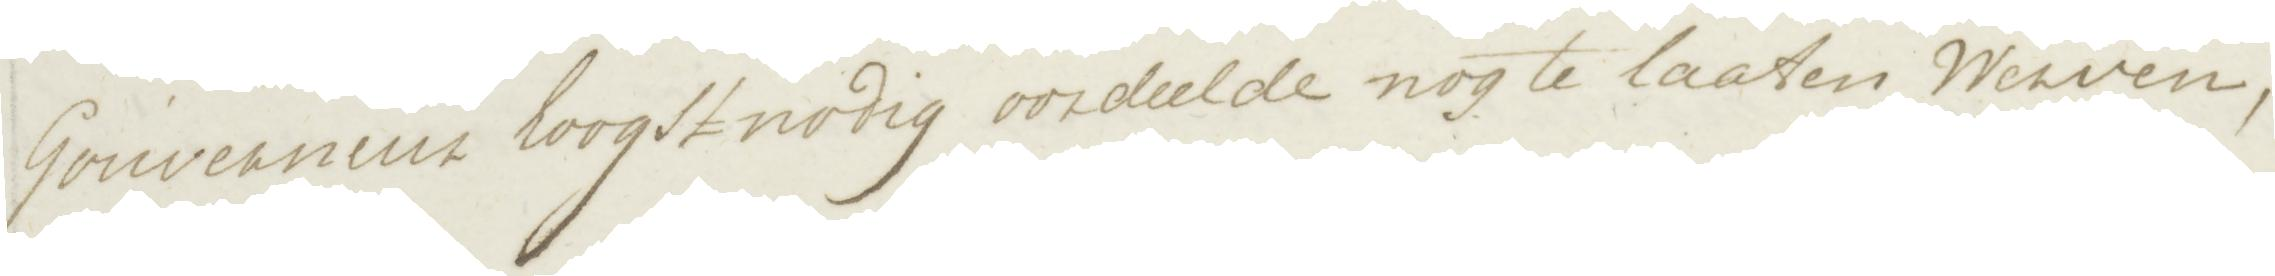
Gouverneur hoogst nodig oordeelde nog te laaten werven,
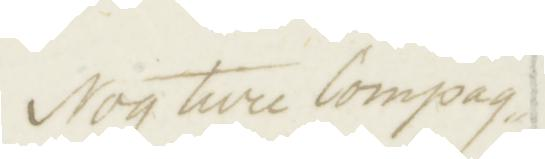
Nog twee Compag„
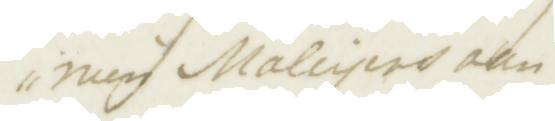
„nien Maleijers aan
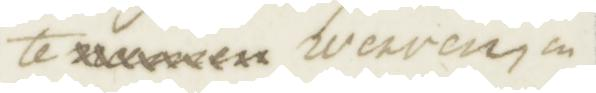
te nemen werven, en
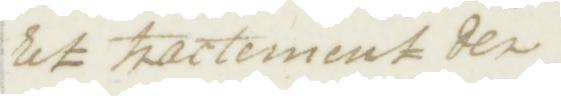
het tractement der
